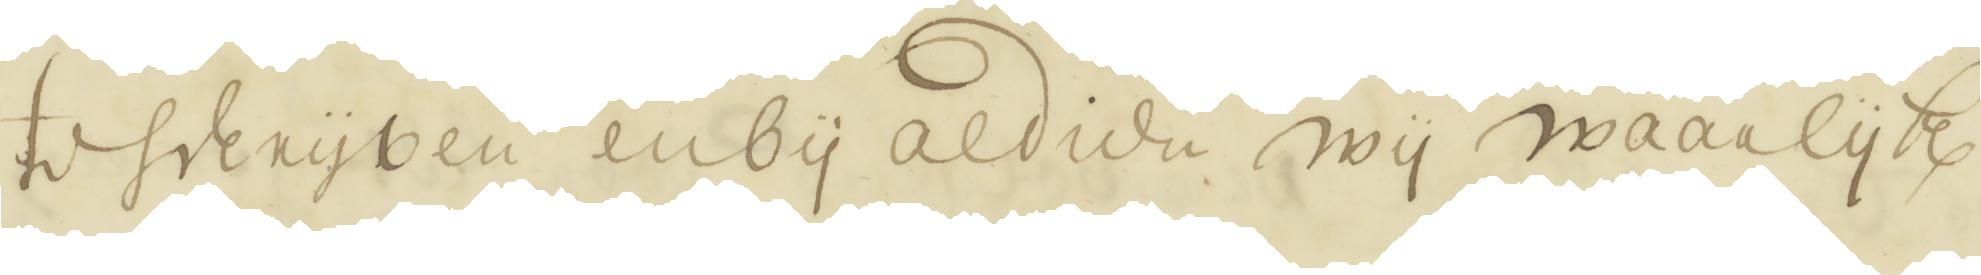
te schrijven en bij aldien wij waarlijk
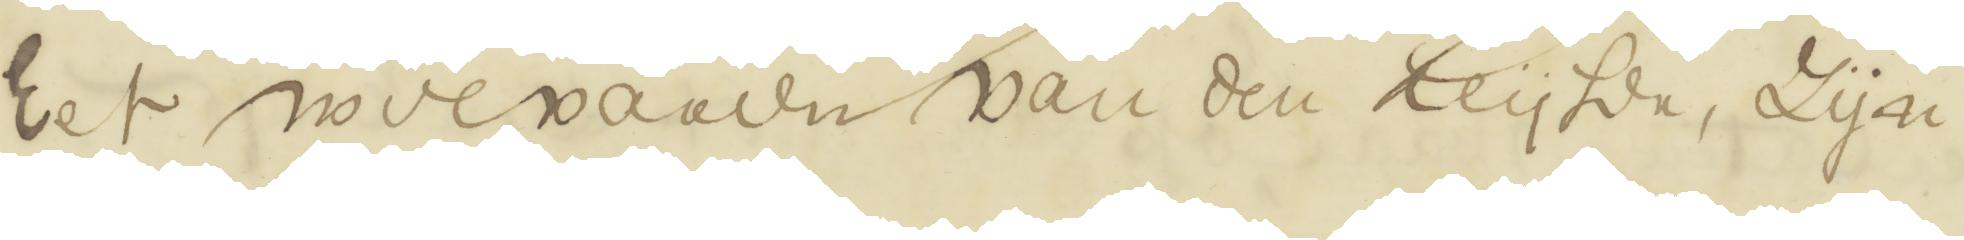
het welvaren van den keijser, zijn
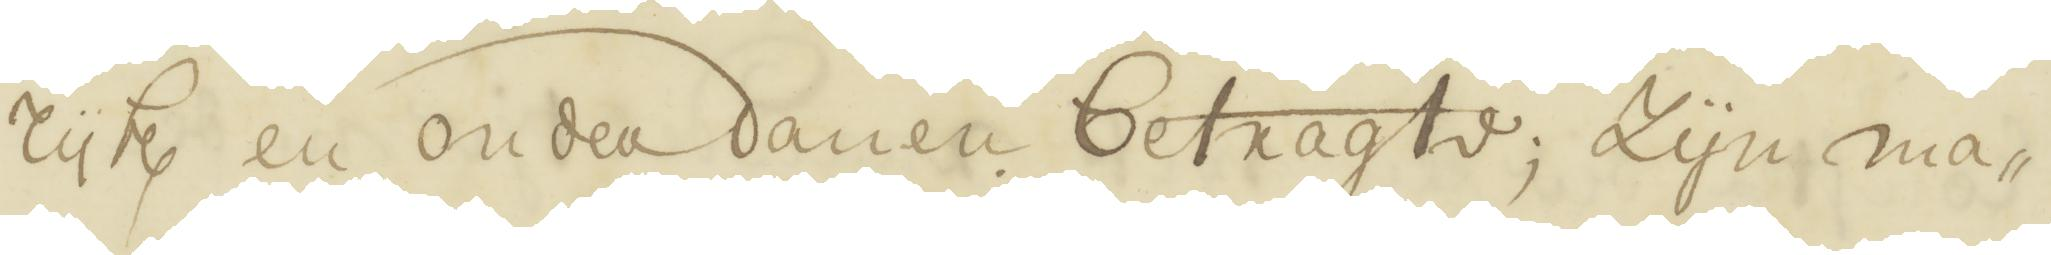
rijk en onderdanen betragte; zijn ma„
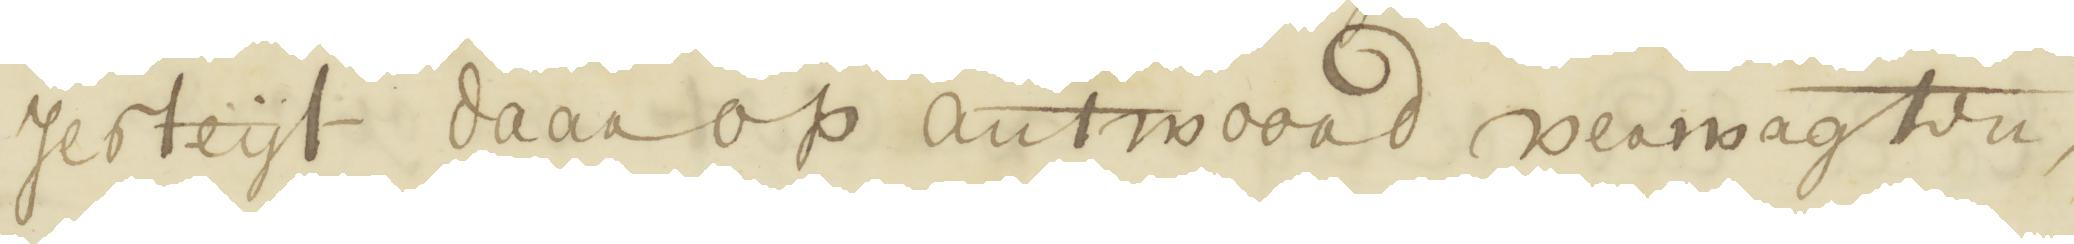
jesteijt daar op antwoord verwagten,
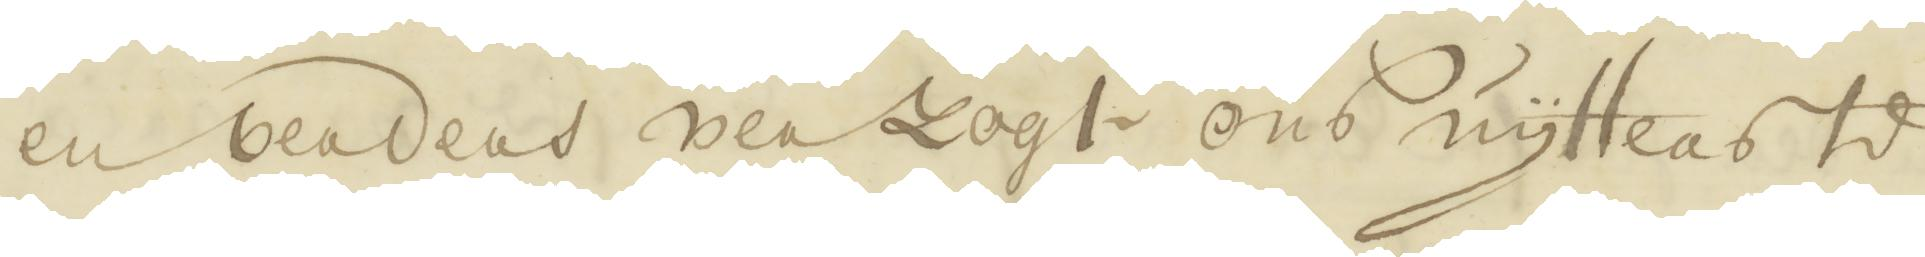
en verders verzogt ons uijtterste
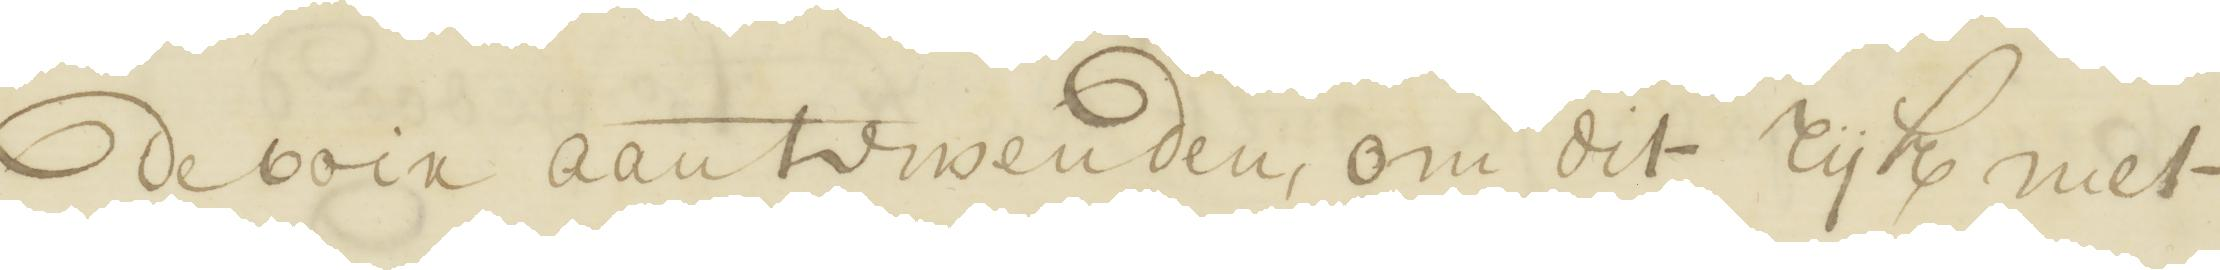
devoir aan tewenden, om dit rijk met
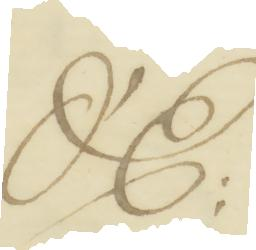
d'E:
